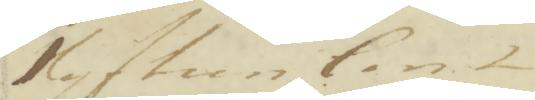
Vyftien Cents
